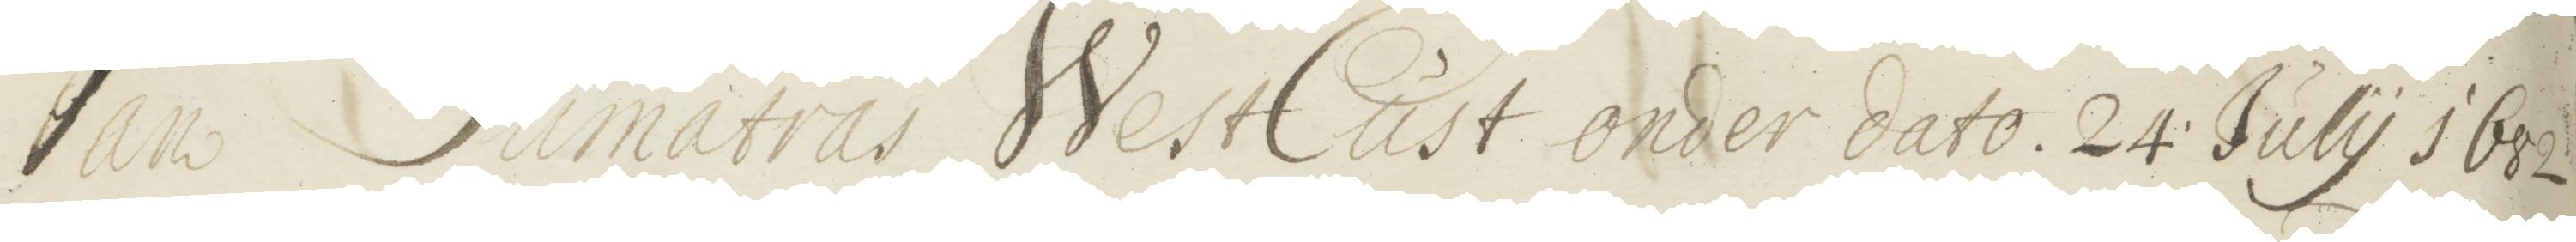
Van Sumatras Westcust onder dato. 24. Julij 1682
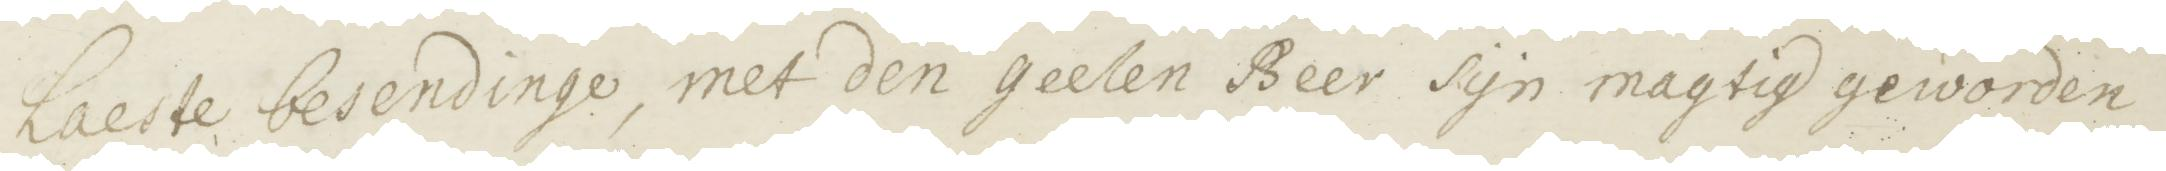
laeste besendinge, met den geelen Beer sijn magtig geworden
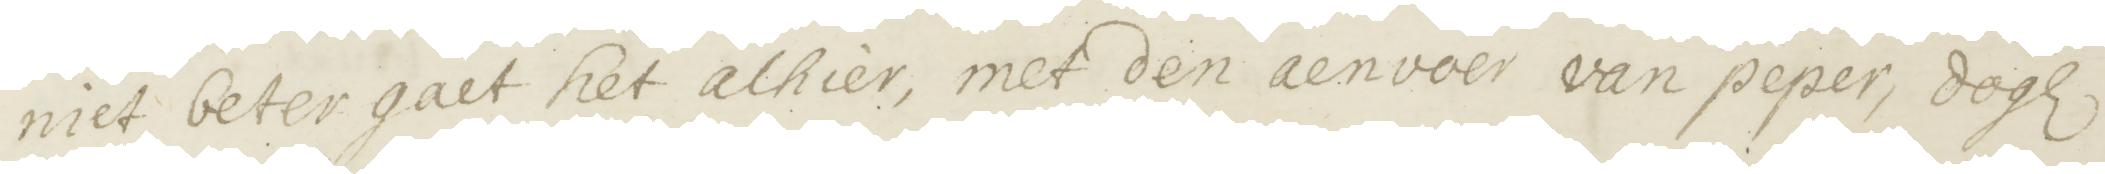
niet beter gaet het alhier, met den aenvoer van peper, dogh
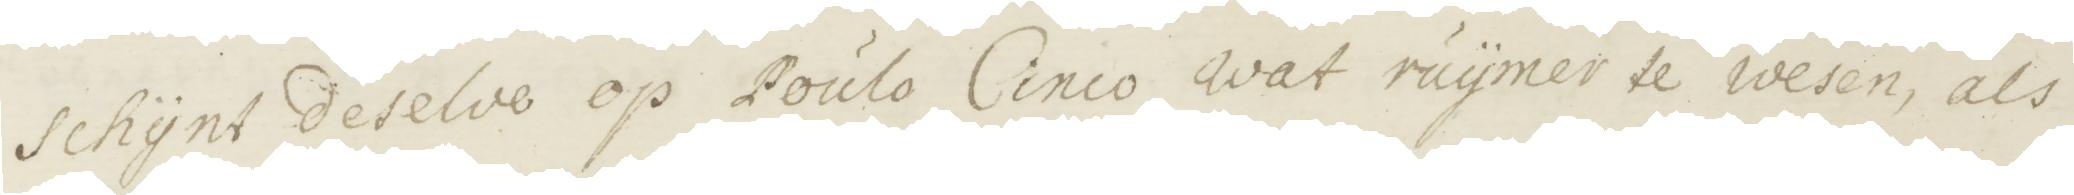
schijnt deselve op Poulo Circo wat ruijmer te wesen, als
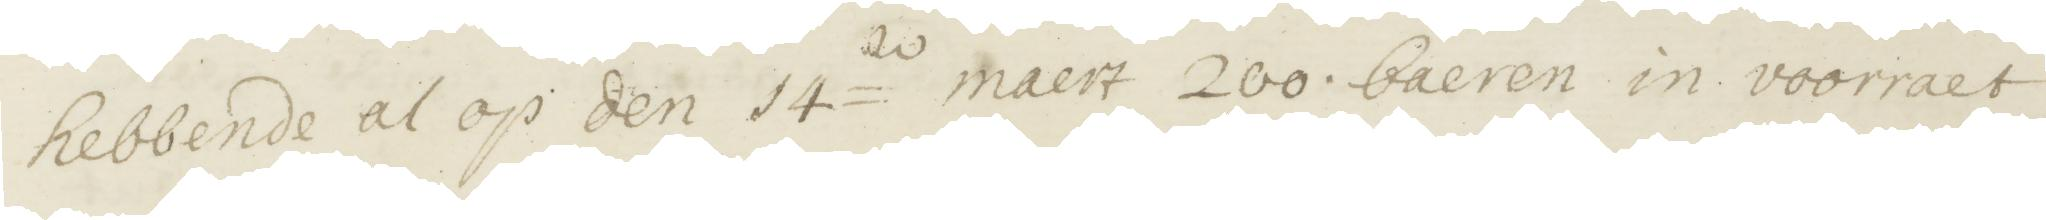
hebbende al op den 14=en maert 200 baeren in voorraet
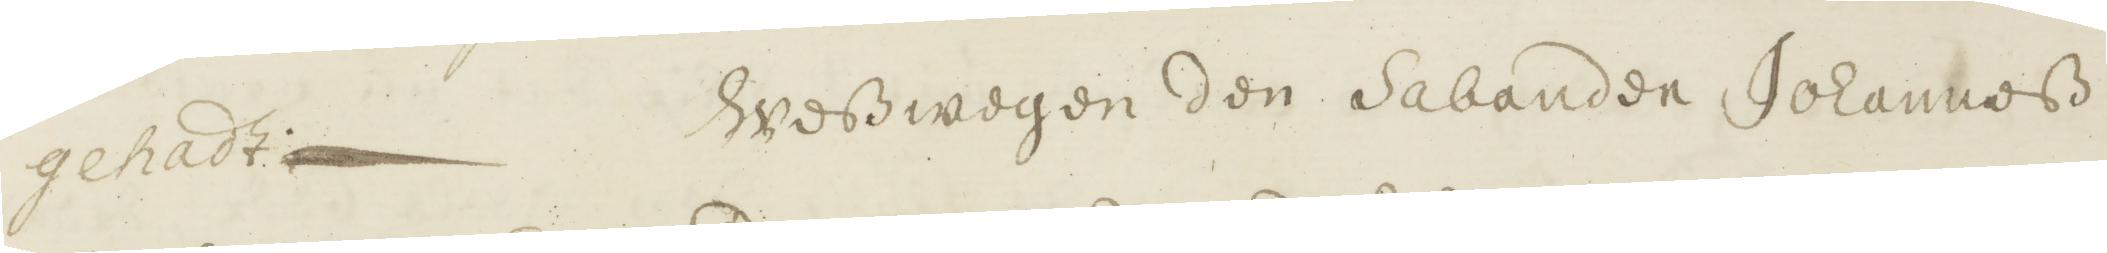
gehadt. Weswegen den Sabander Johannes
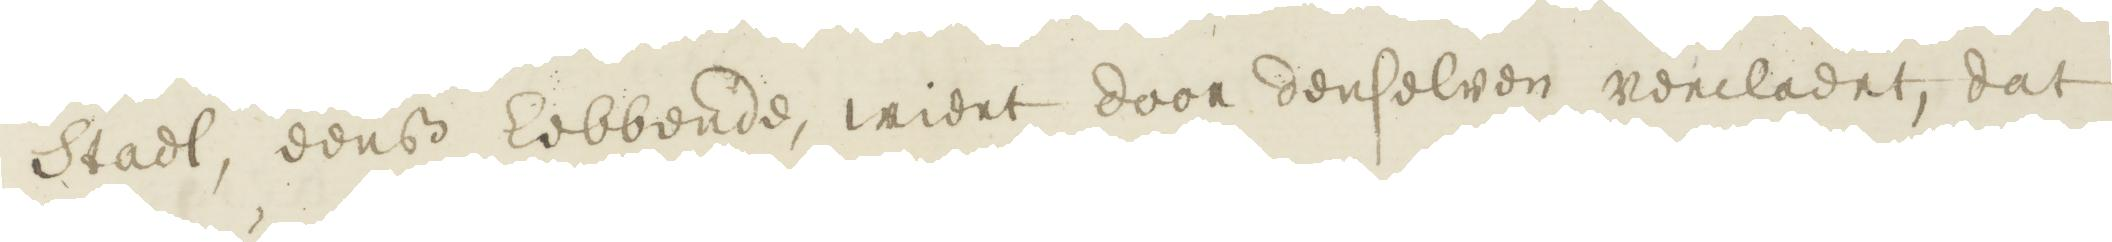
stael, eens hebbende, wiert door derselven verclaert, dat
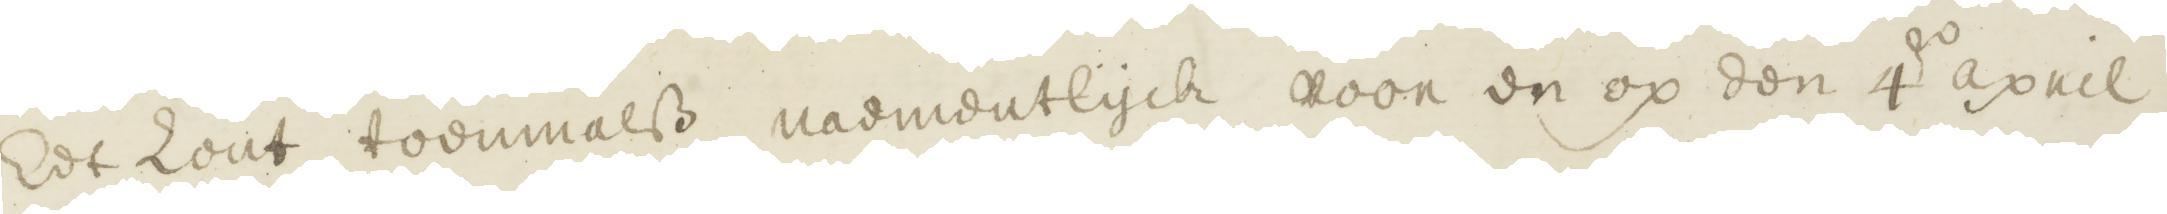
het zout toenmaels naementlijck voor en op den 4de april
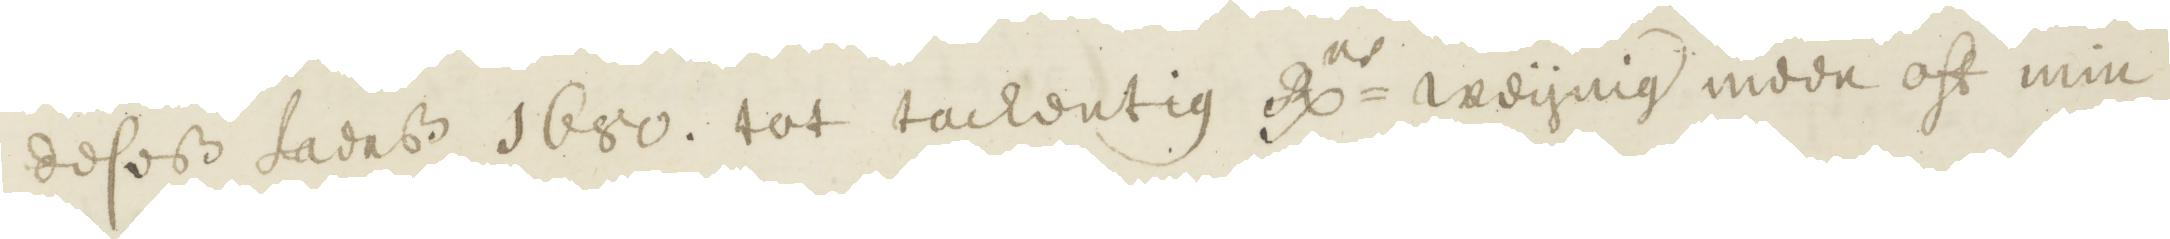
deses Jaers 1680. tot tachentig Rx=rs weijnig meer oft min
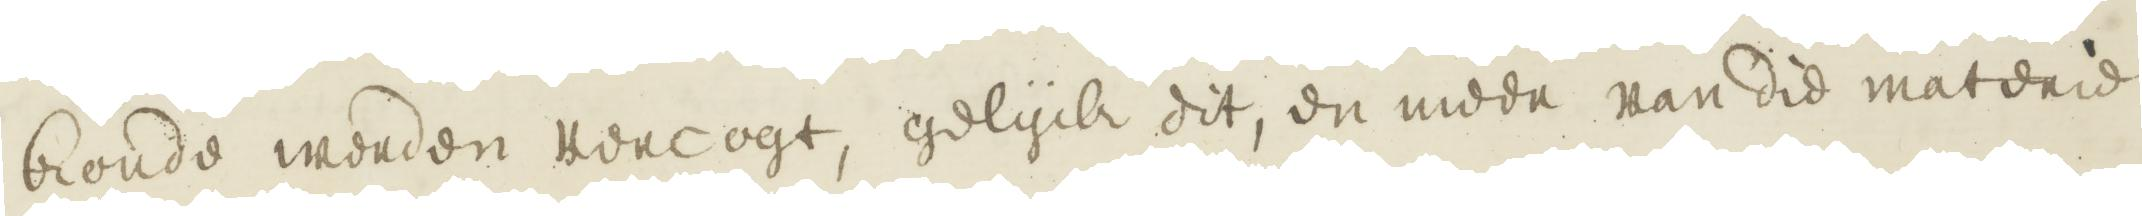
konde werden vercogt, gelijck dit, en meer van die materie
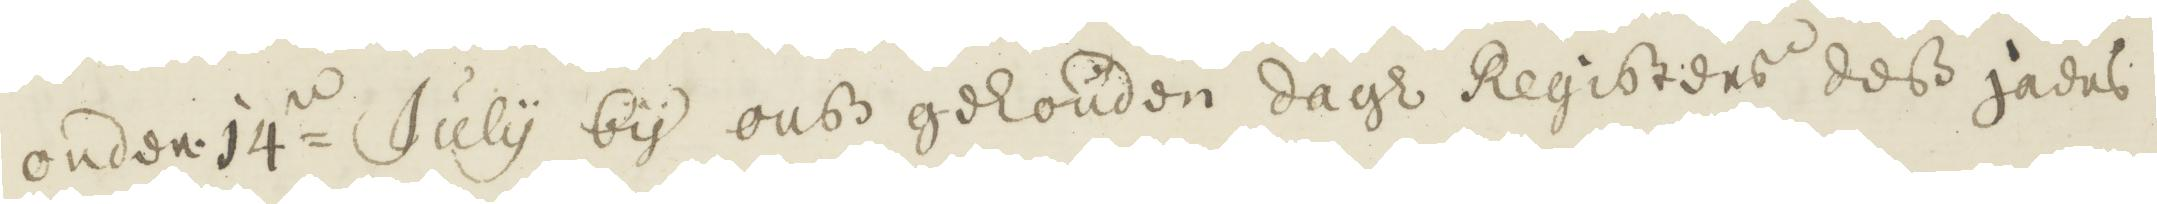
onder 14=e Julij bij ons gehouden dagh Registers des jaers
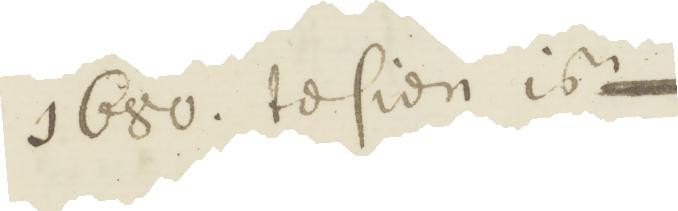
1680. tesien is.
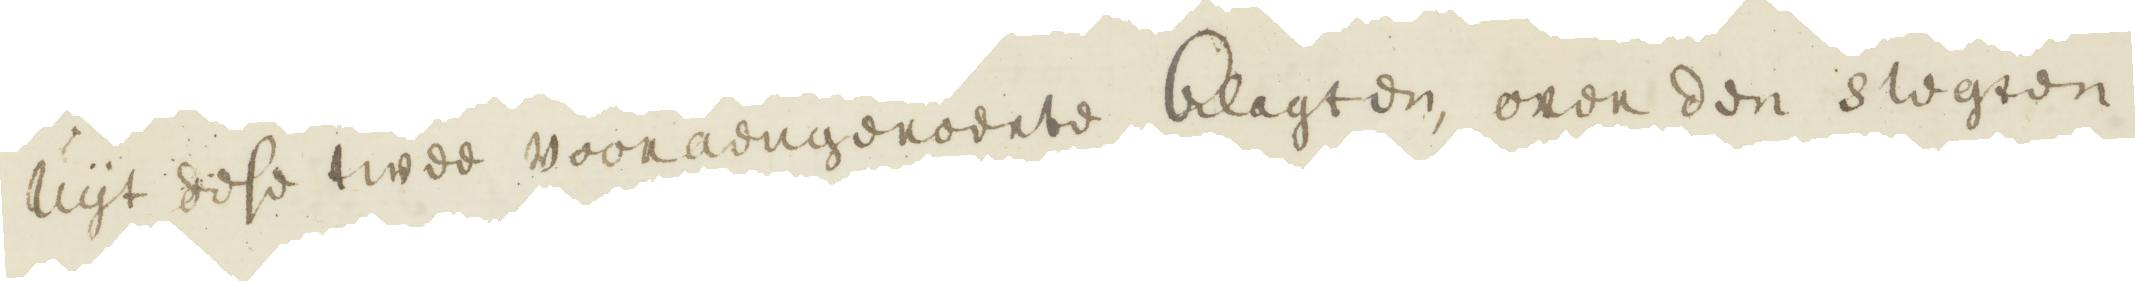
Uijt dese twee vooraengeroerte klagten, over den slegten
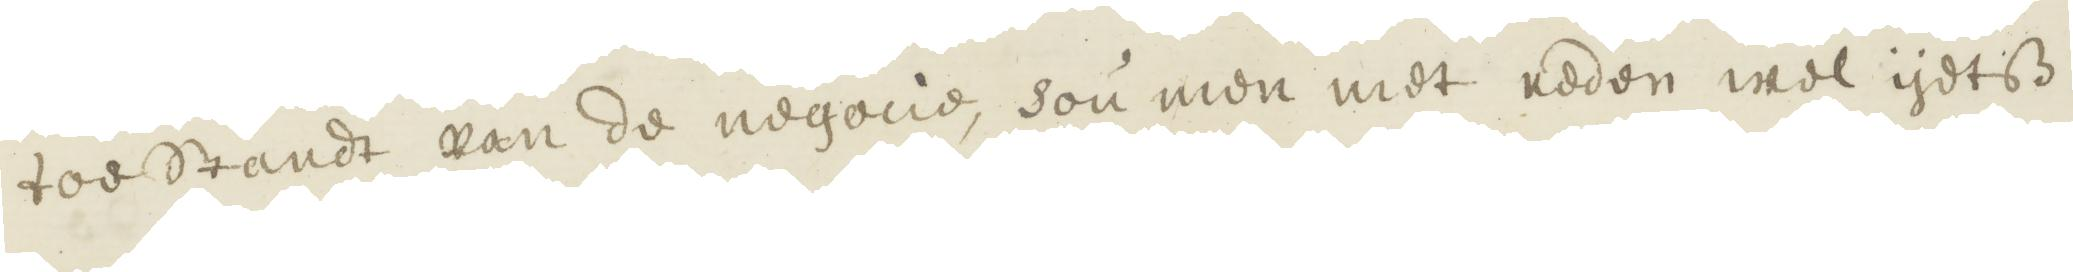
toestandt van de negocie, sou men met reden wel ijets
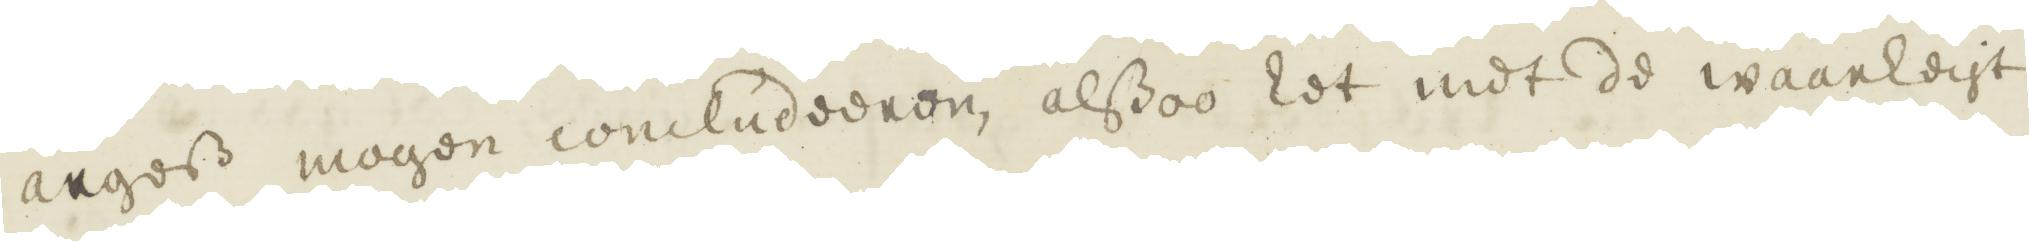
argers mogen concludeeren, alsoo het met de waarheijt
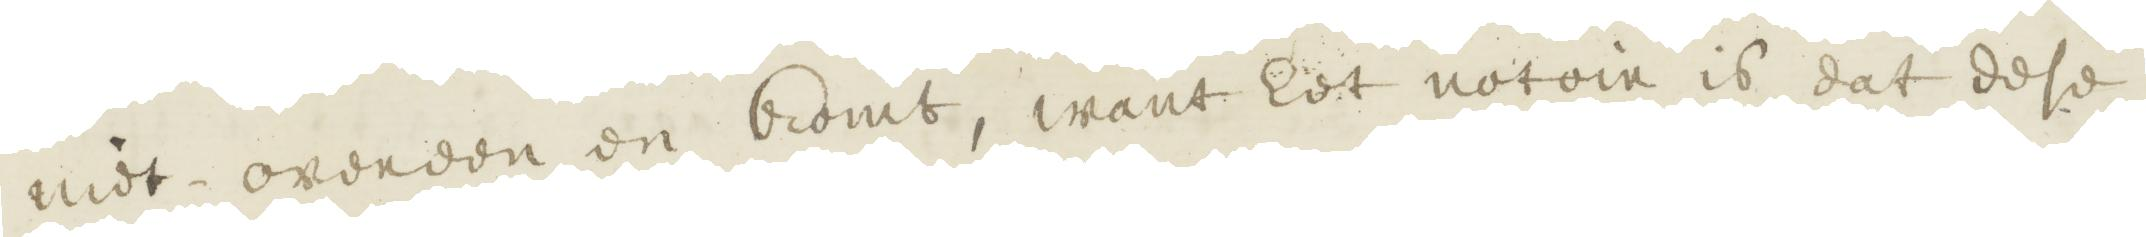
niet - overeen en komt, want het notoir is dat dese
